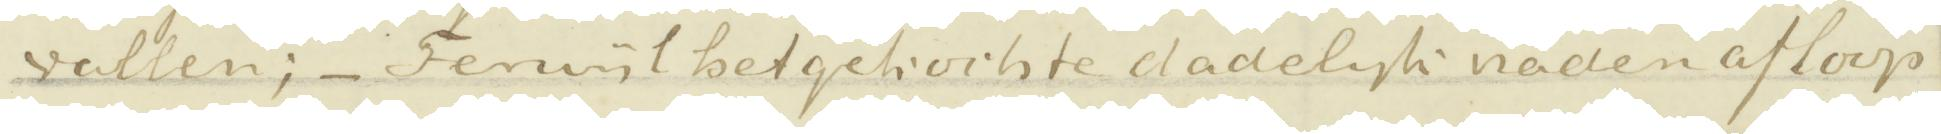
vallen; - Terwijl het gekochte dadelyk na den afloop
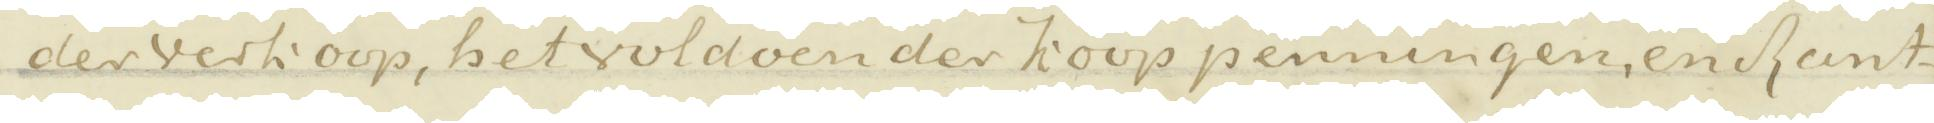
der verkoop, het voldoen der kooppenningen, en Rant=
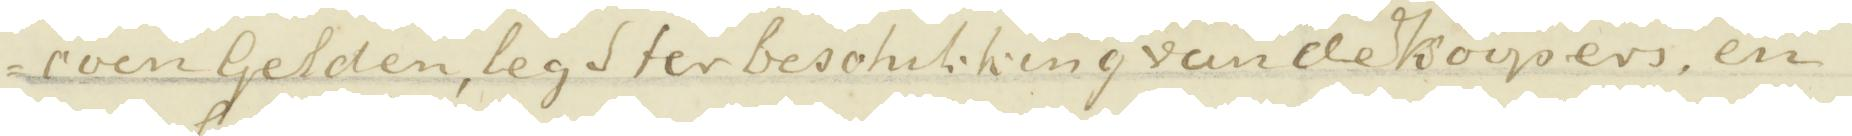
=soen Gelden, legd ter beschikking van de Koopers, en
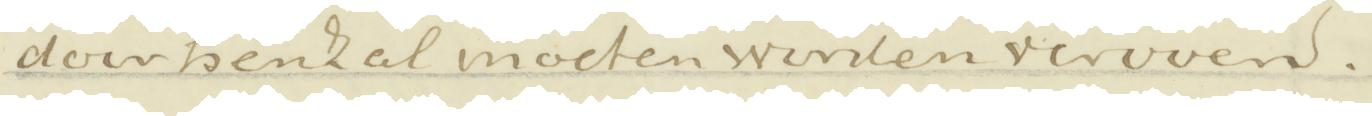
door hen zal moeten worden vervoerd.
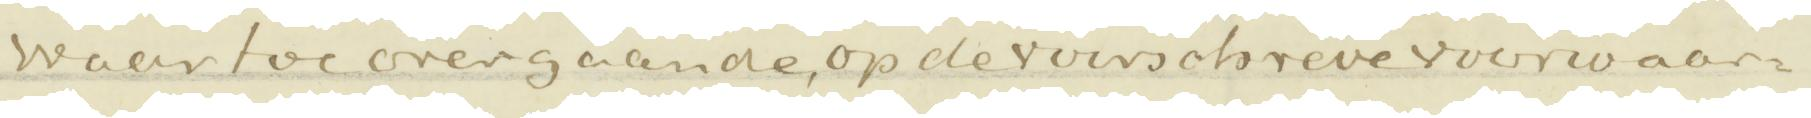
Waartoe overgaande op de voorschreve voorwaar=
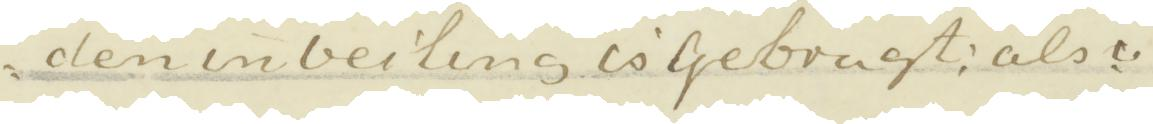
=den in veiling is gebragt, als:
